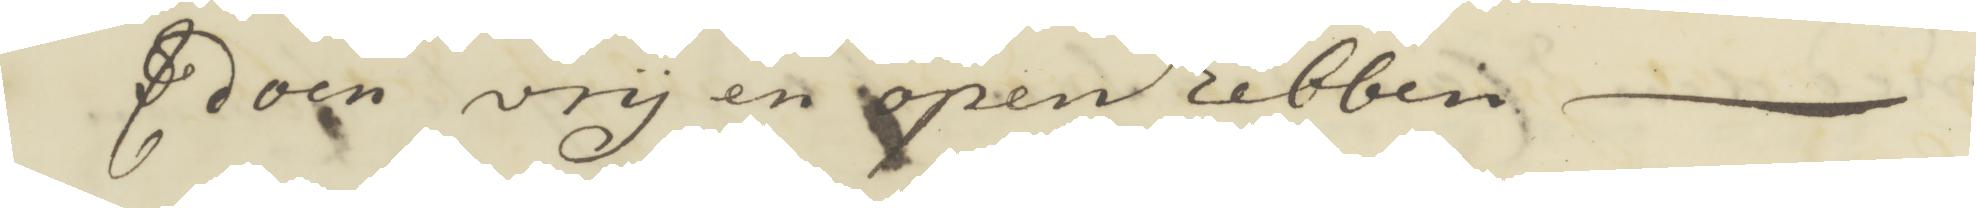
verdoen vrij en open hebben —
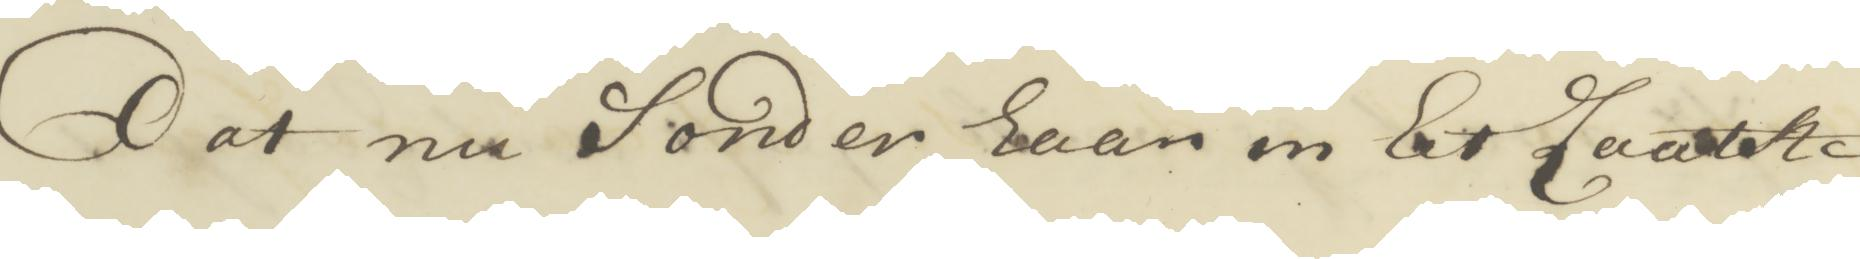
Dat nu sonder haar in het Laatste
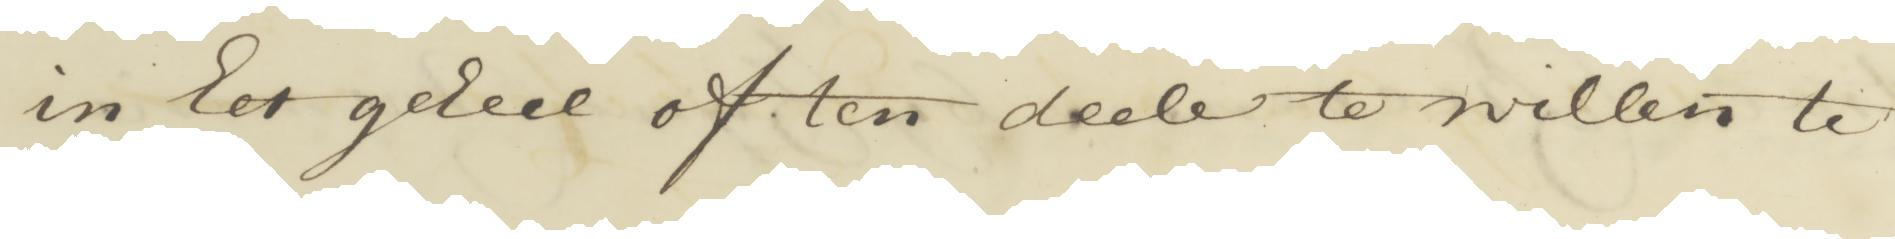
in het geheel of ten deele te willen te
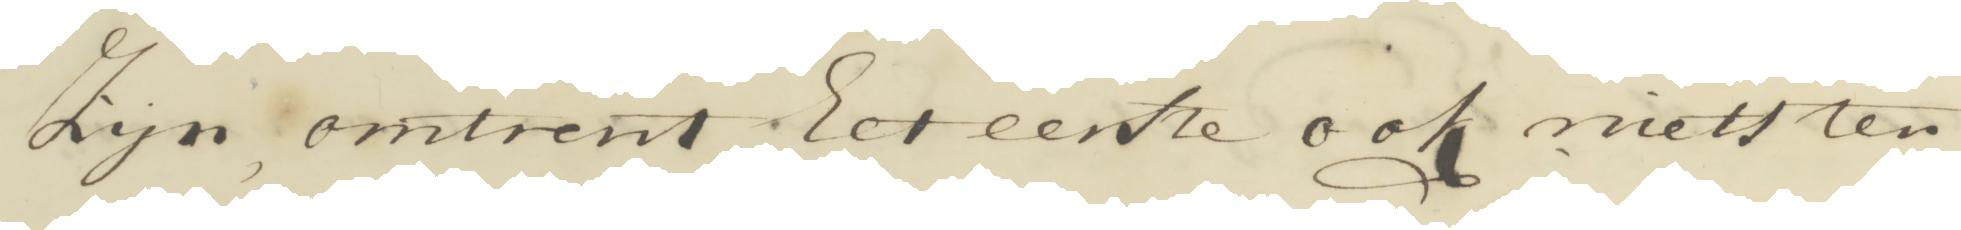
zijn, omtrent het eerste ook niets ter
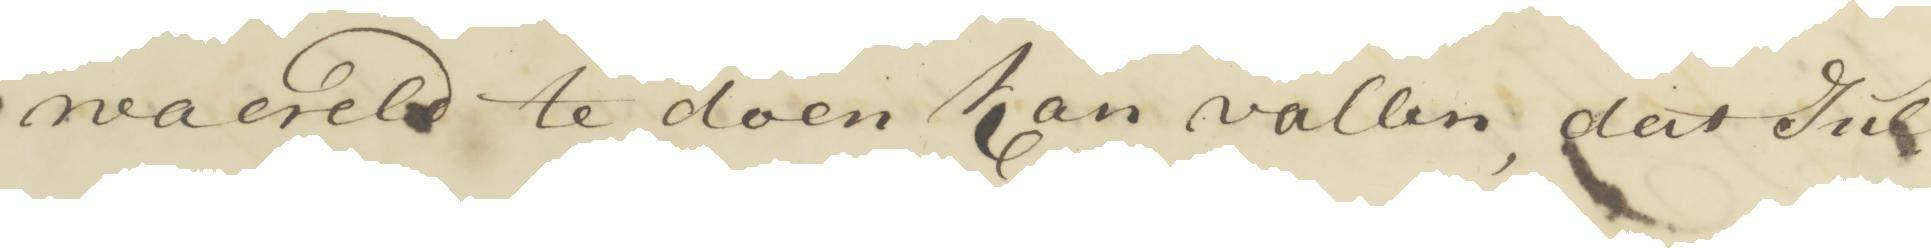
waereld te doen kan vallen, dat sul
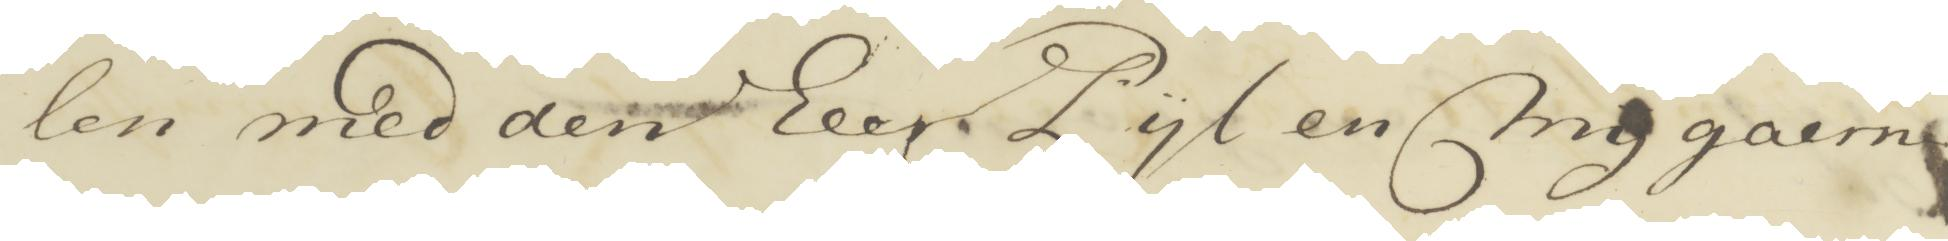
len med den heer Zijl en Mij gaerne
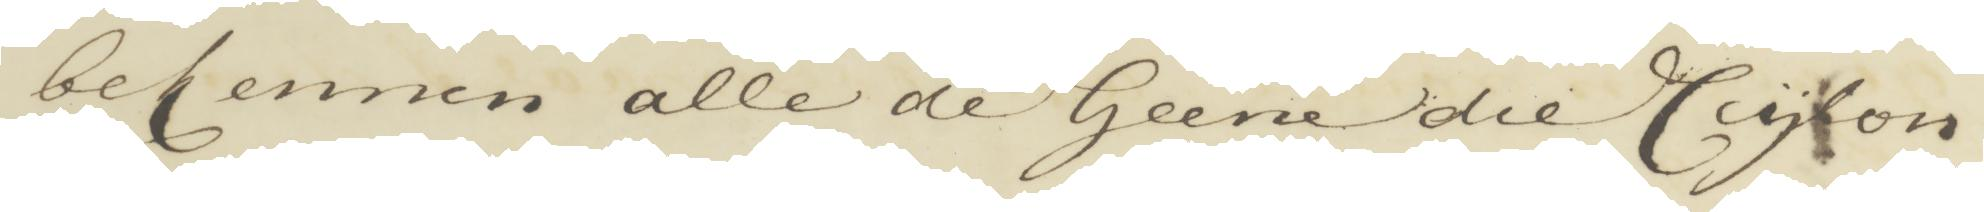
bekennen alle de Geene die Ceijlon
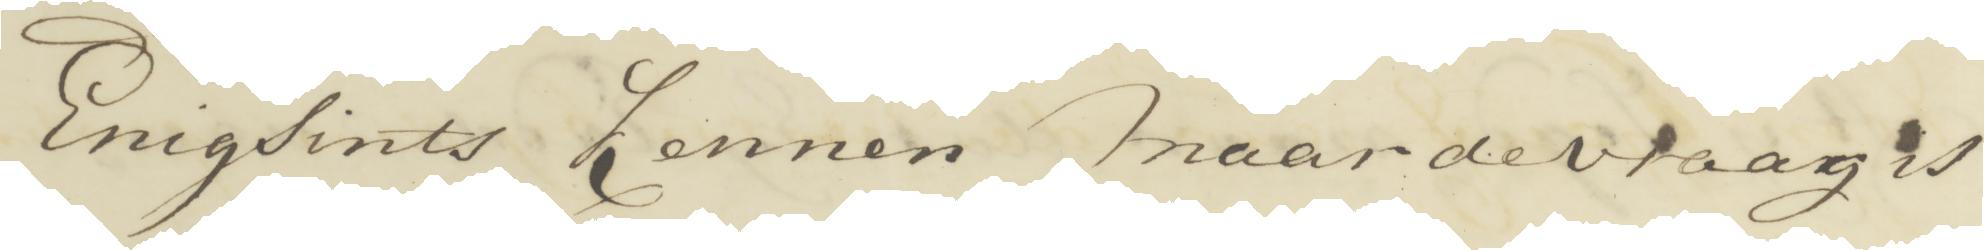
Enigsints kennen, maar devraag is
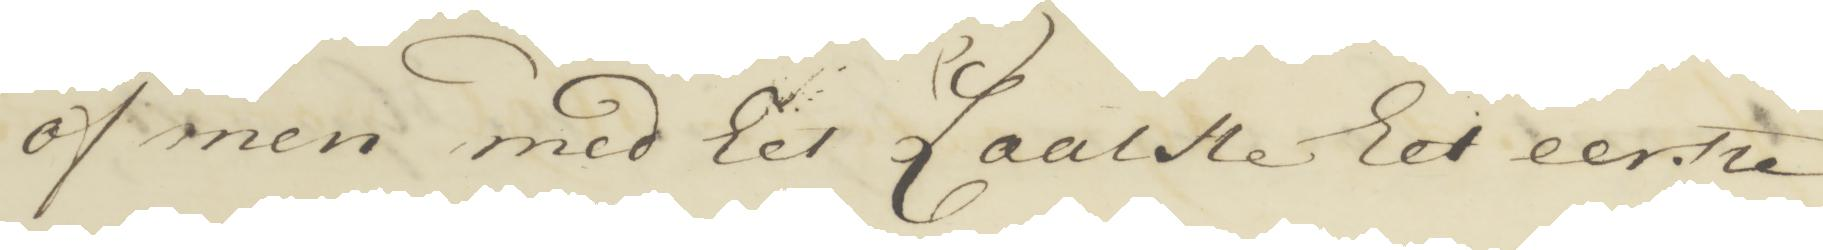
of men med het Laatste het eerste
